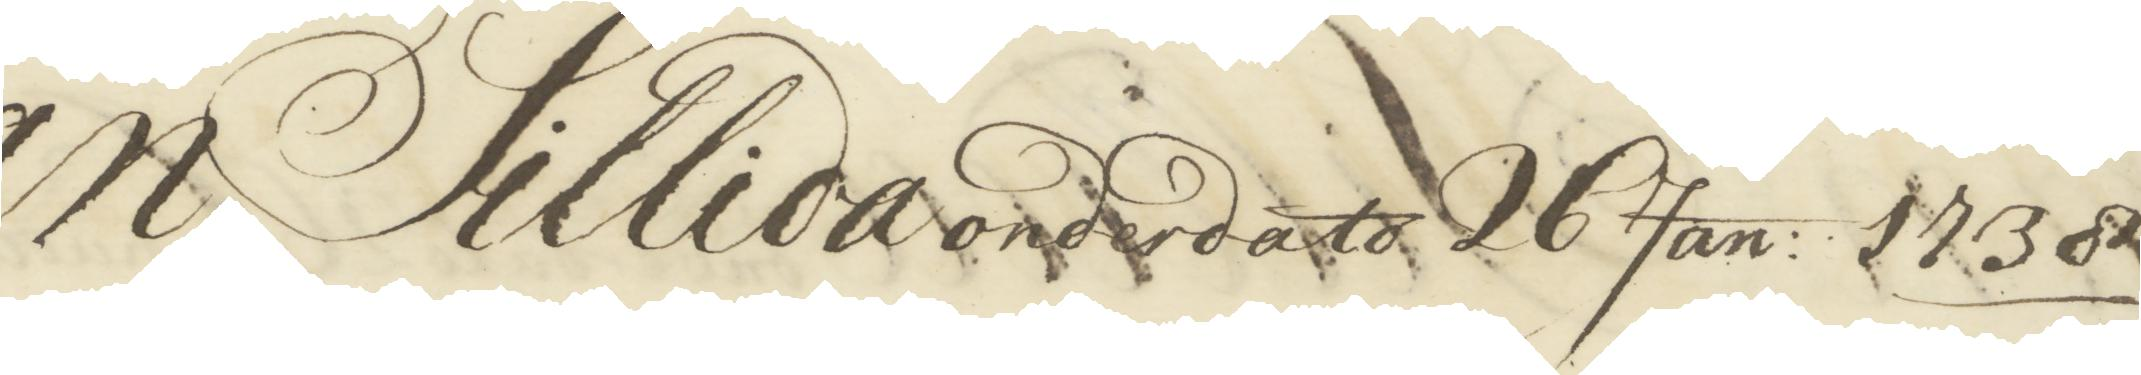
Van Sillida onderdato 26 Jan: 1738
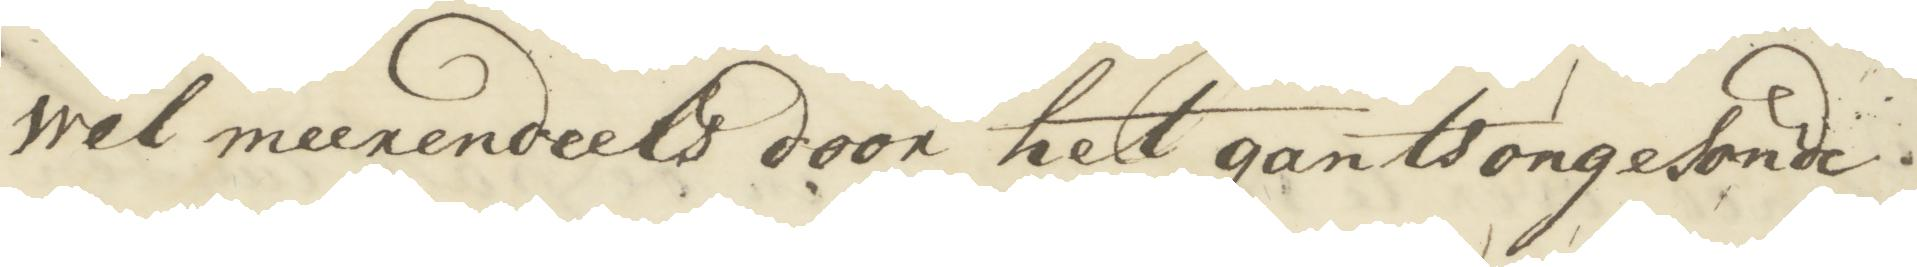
wel meerendeels door het gants ongesonde
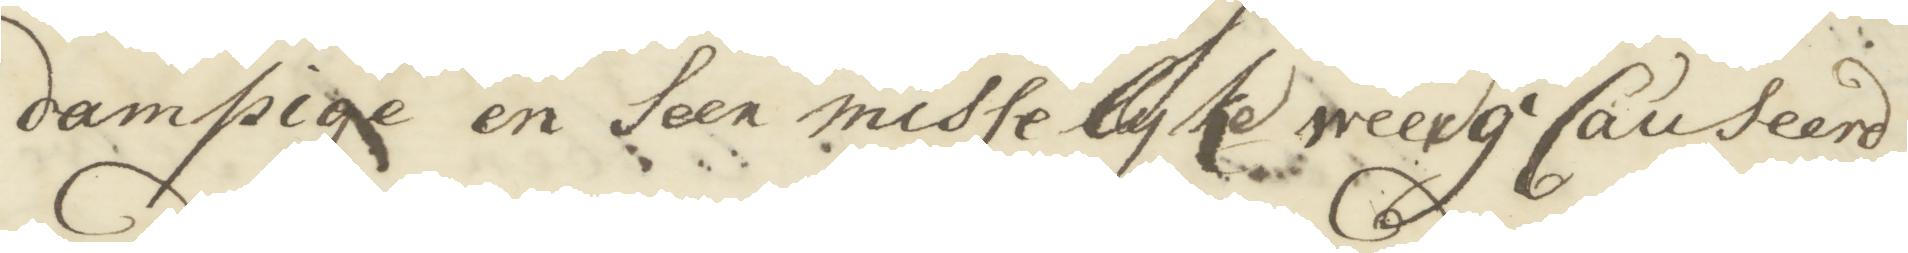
dampige en seer misselyke weer g’Causeerd
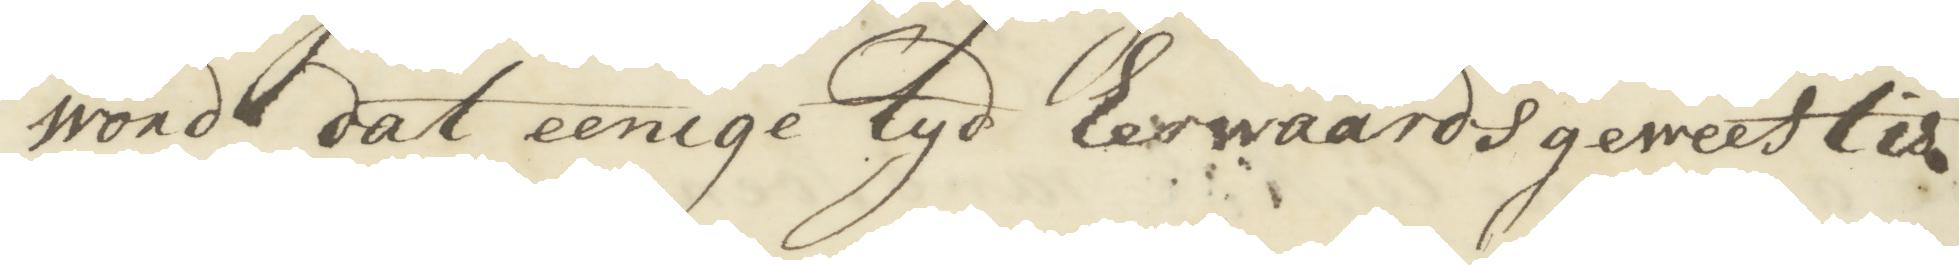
word dat eenige tyd herwaards geweest is.
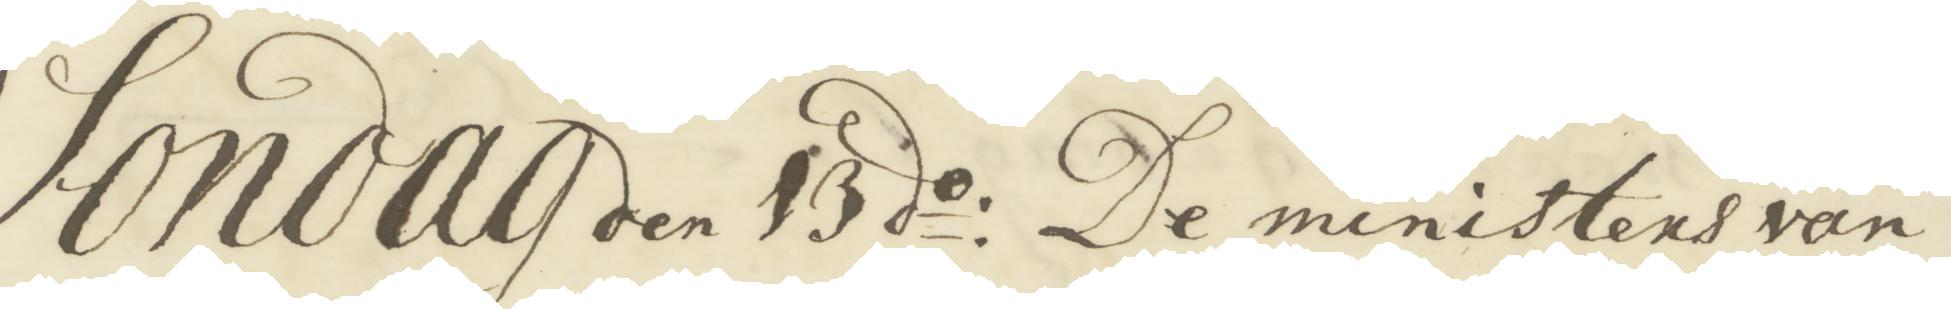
Sondag den 13 d=o: De ministers van
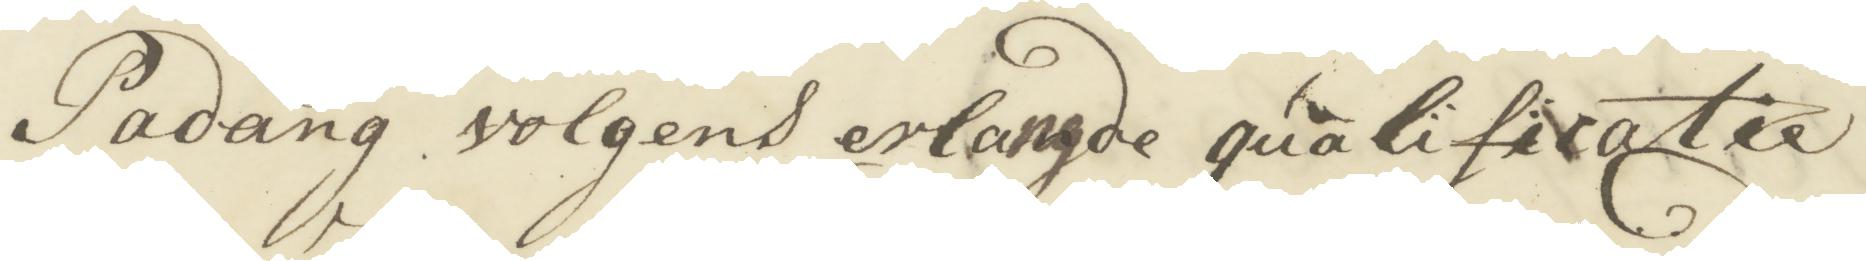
Padang volgens erlangde qualificatie
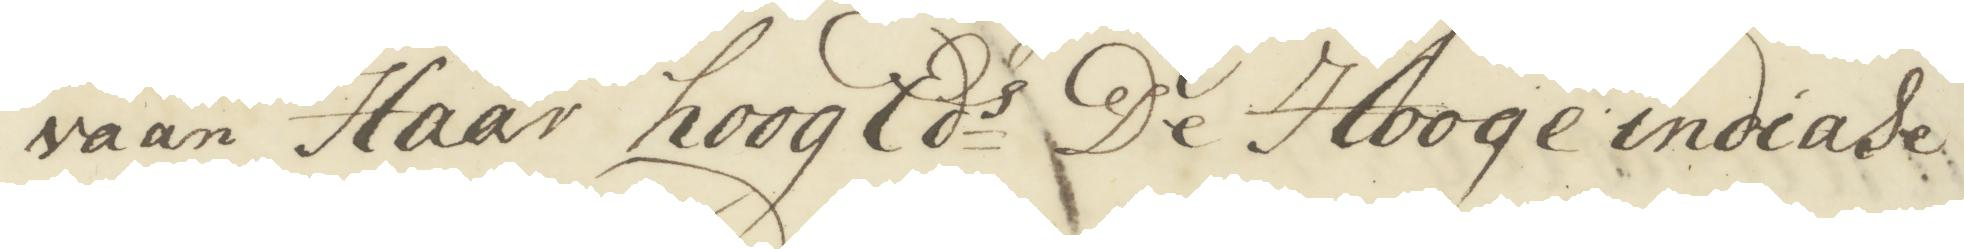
vaan Haar hoog Ed=s De Hooge indiase
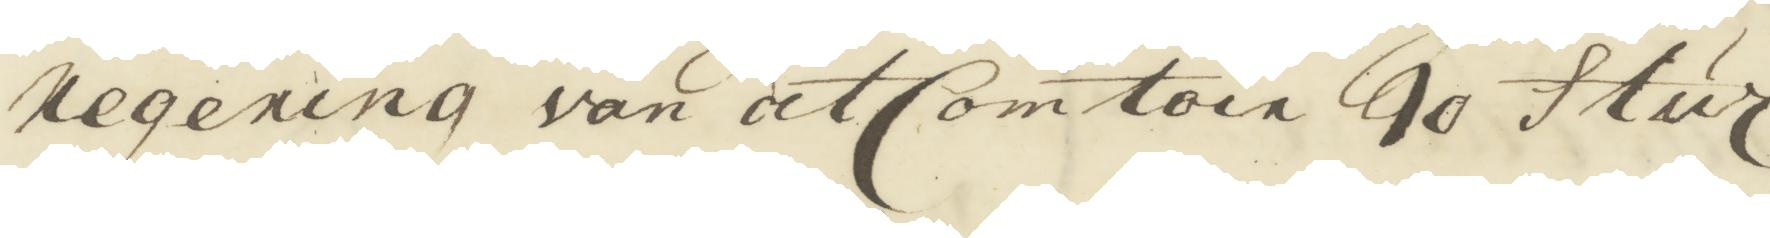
regering van dit Comtoir 40 stux
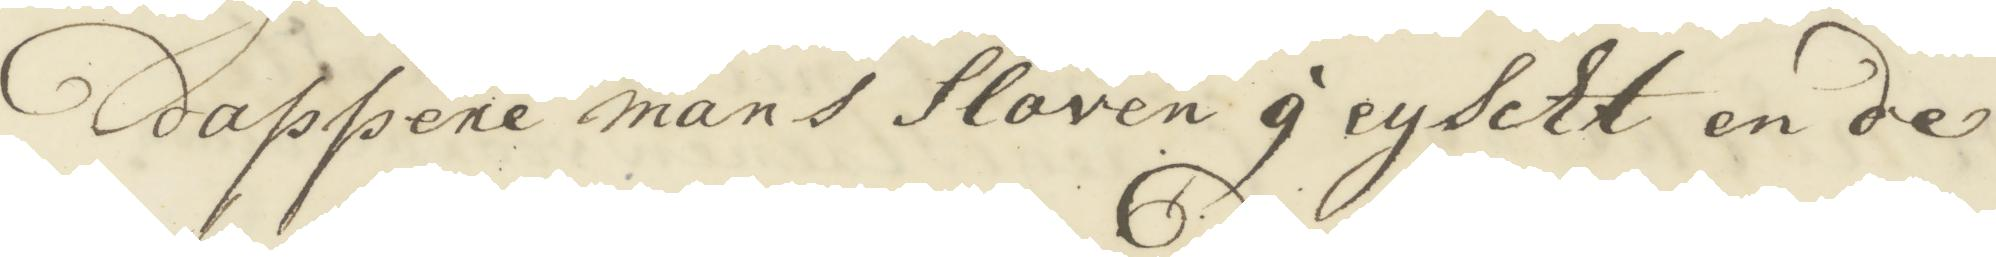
dappere mans slaven g’eyscht en de
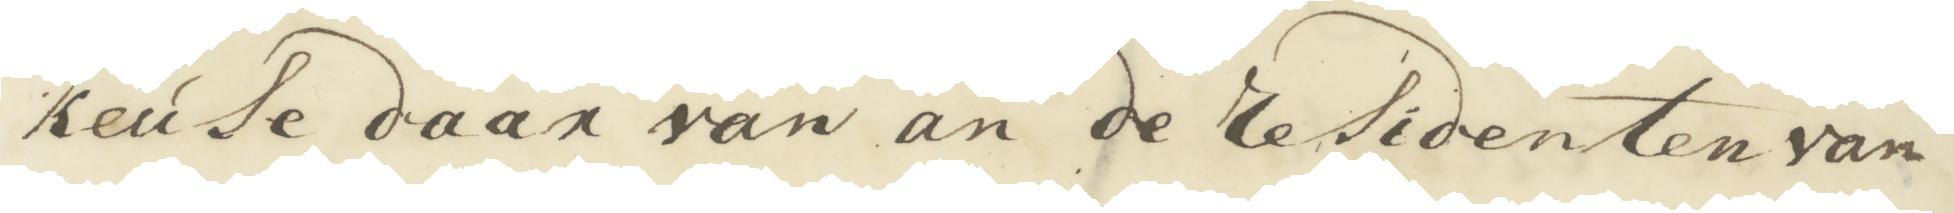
keuse daar van an de residenten van
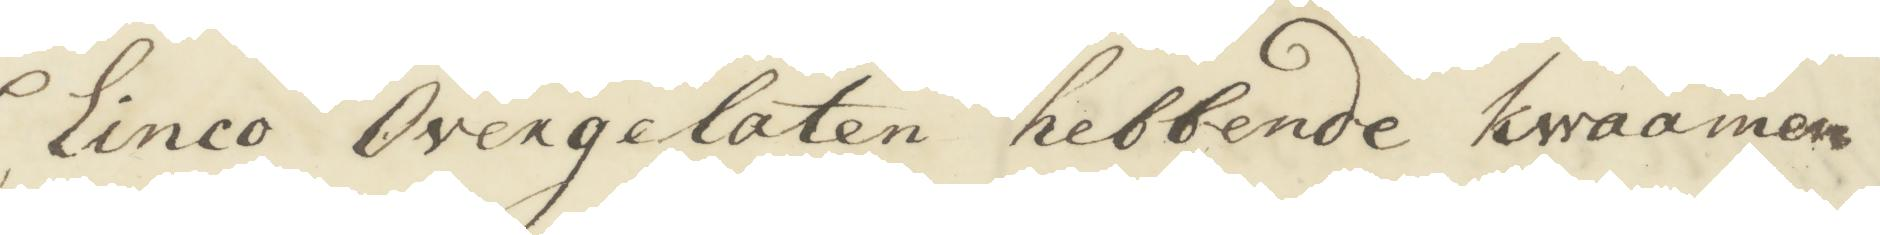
Chinco Overgelaten hebbende kwaamen
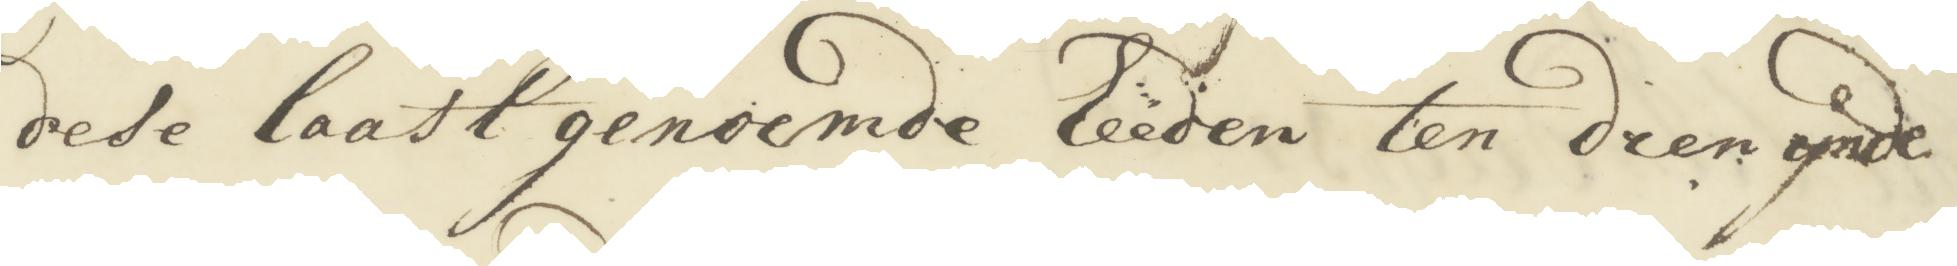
dese laast genoemde leeden ten dien ynde
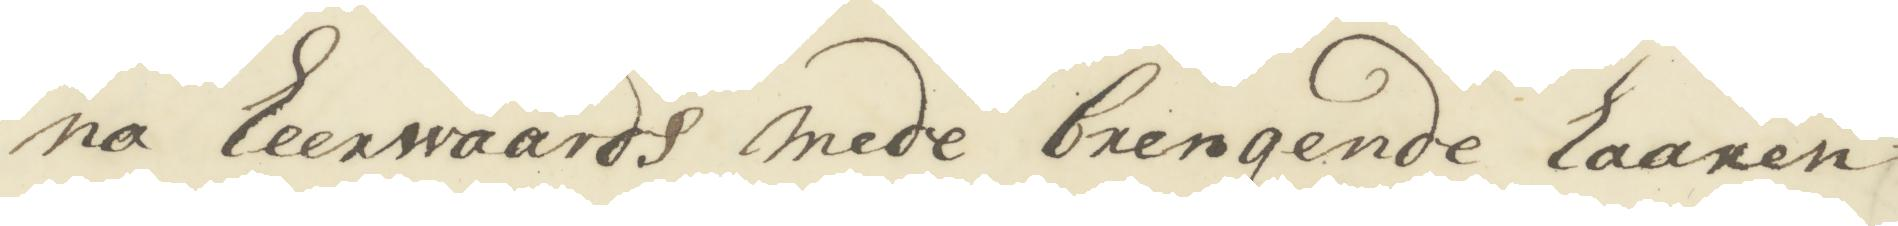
na heerwaards mede brengende haaren
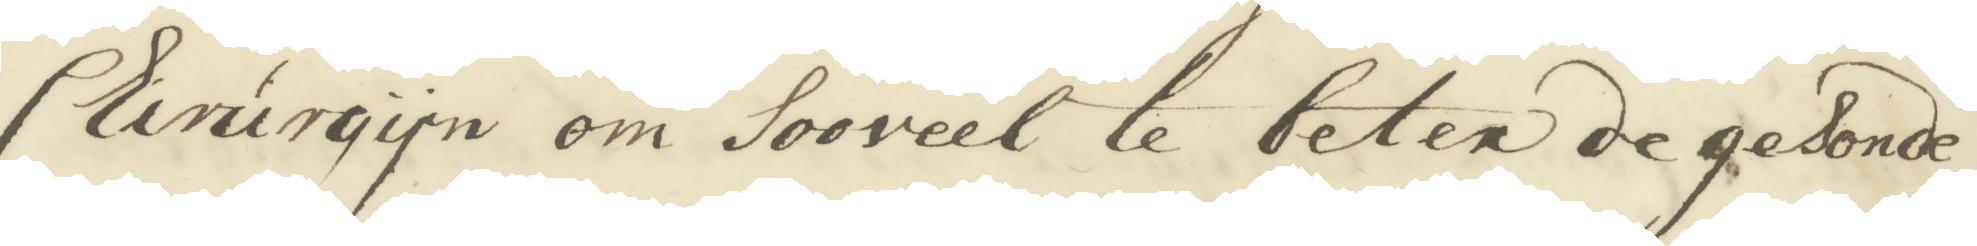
Chirurgijn om sooveel te beter de gesonde
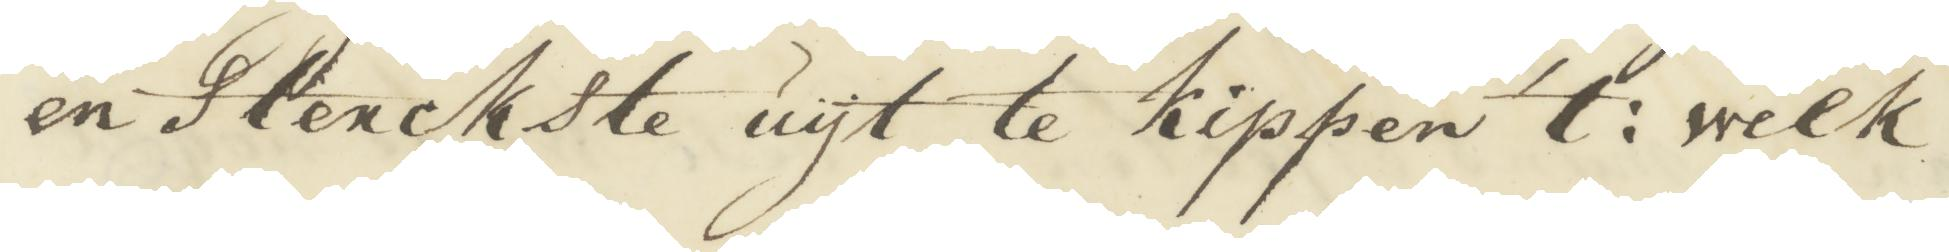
en sterckste uijt te kippen 't: welk
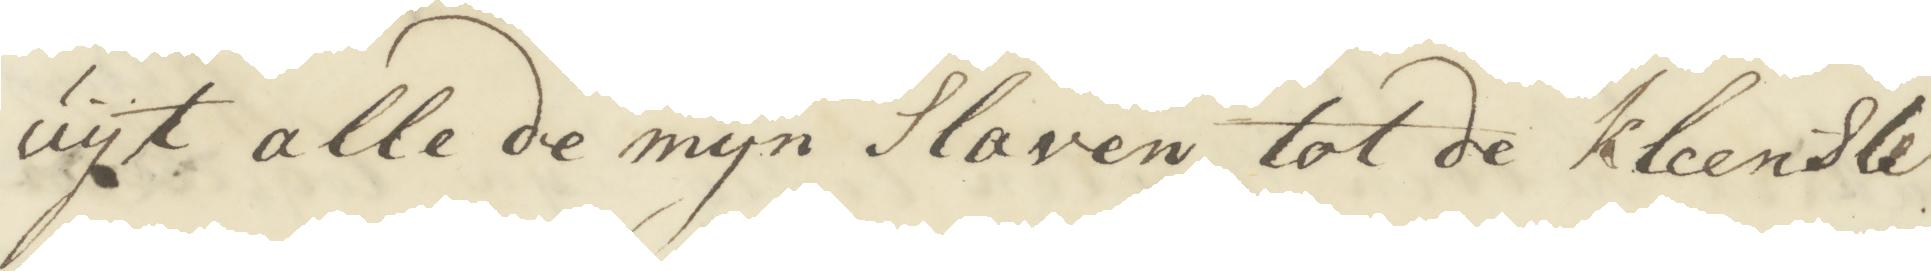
uijt alle de mijn slaven tot de kleenste
